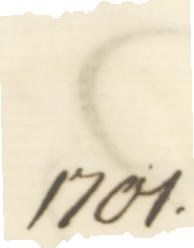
1701.
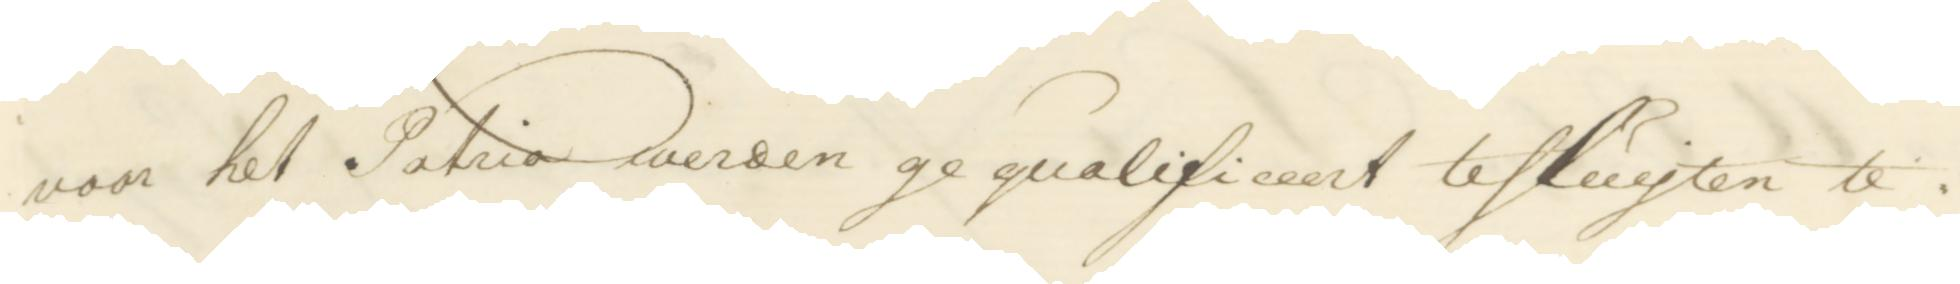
voor het Patria werden gequalificeert tesluijten te
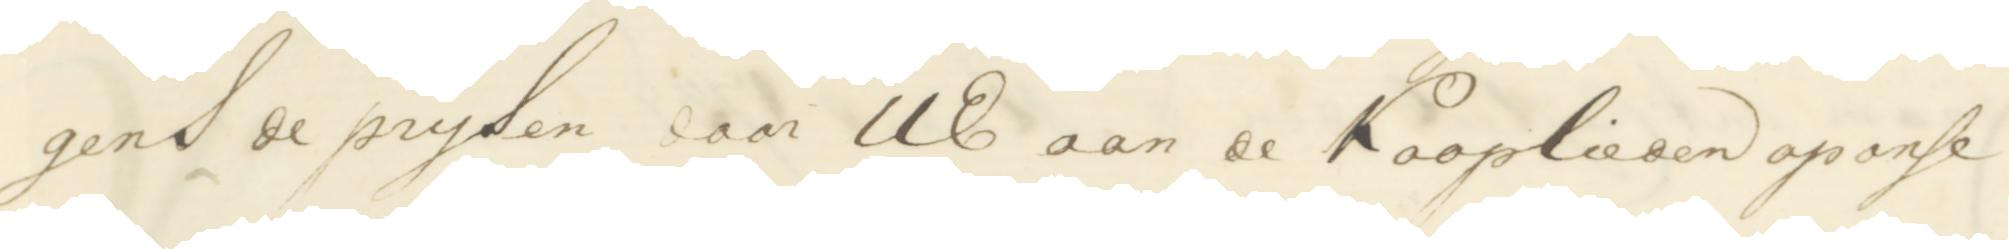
gens de prijsen door UE aan de Kooplieden op onse
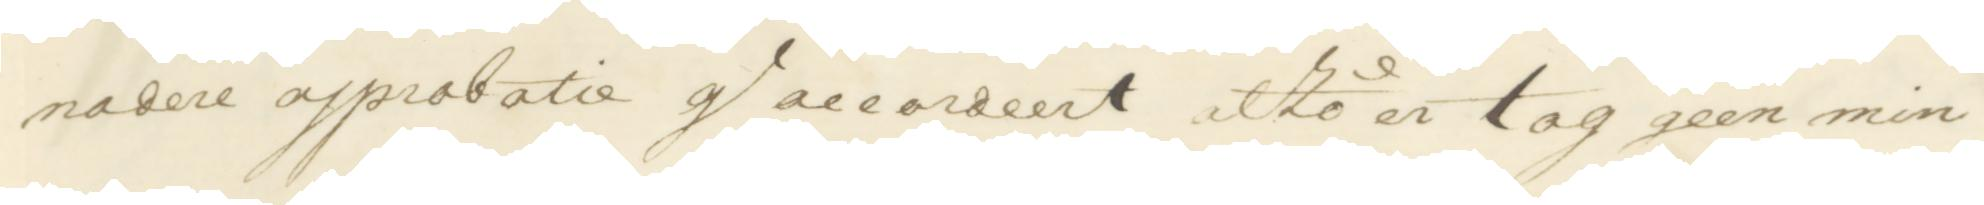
nadere approbatie g’accordeert alzo er tog geen min
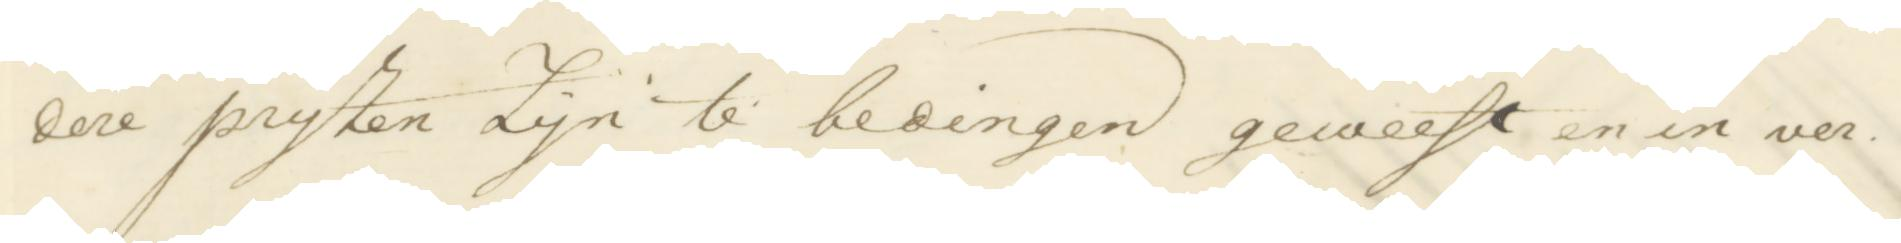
dere prijzen zijn te bedingen geweest en in ver
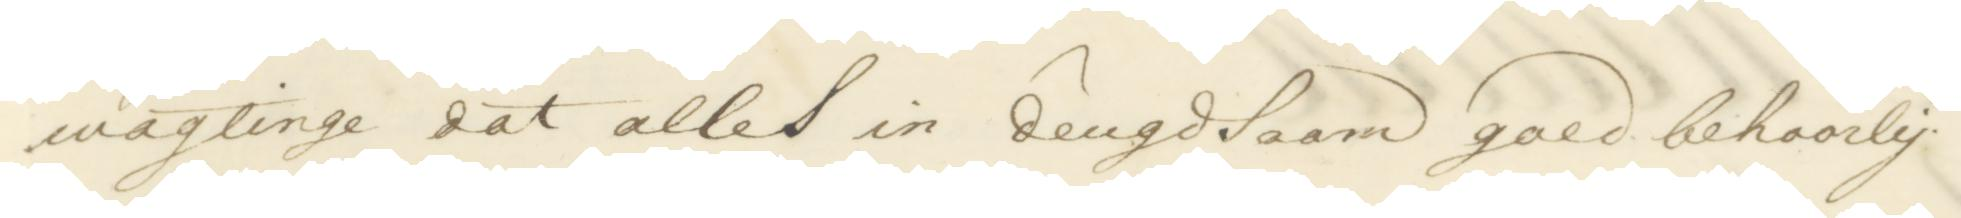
wagtinge dat alles in deugdsaam goed behoorlij
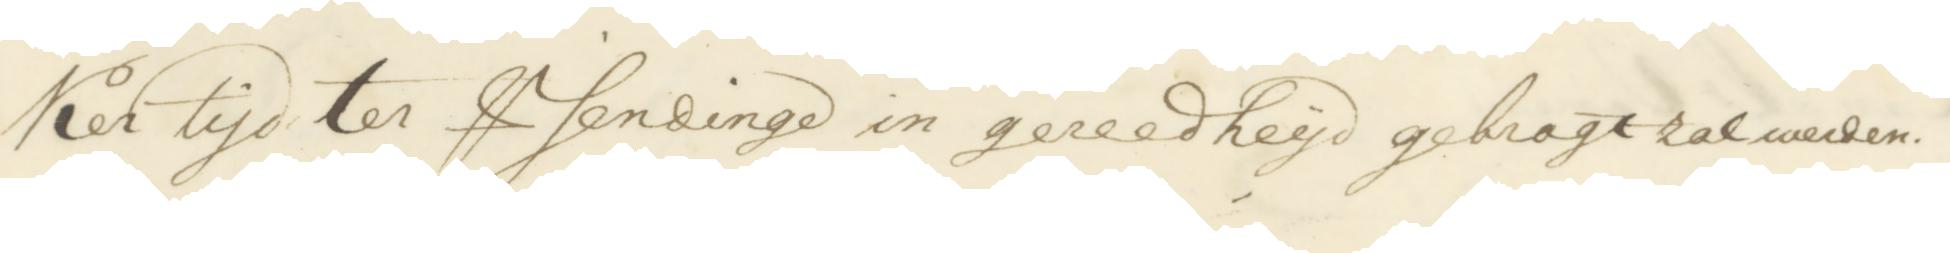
ker tijd ter versendinge in gereedheijd gebrogt zal werden.
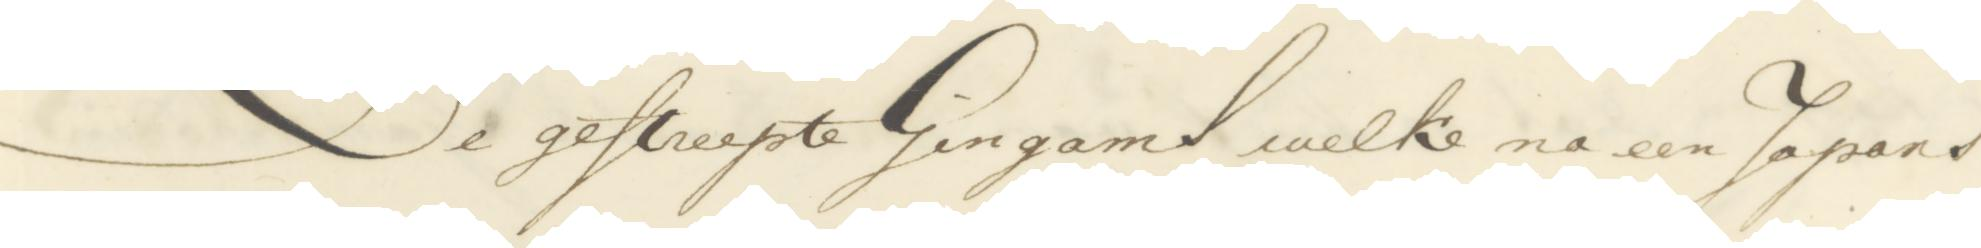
De gestreepte Gingams welke na een Japans
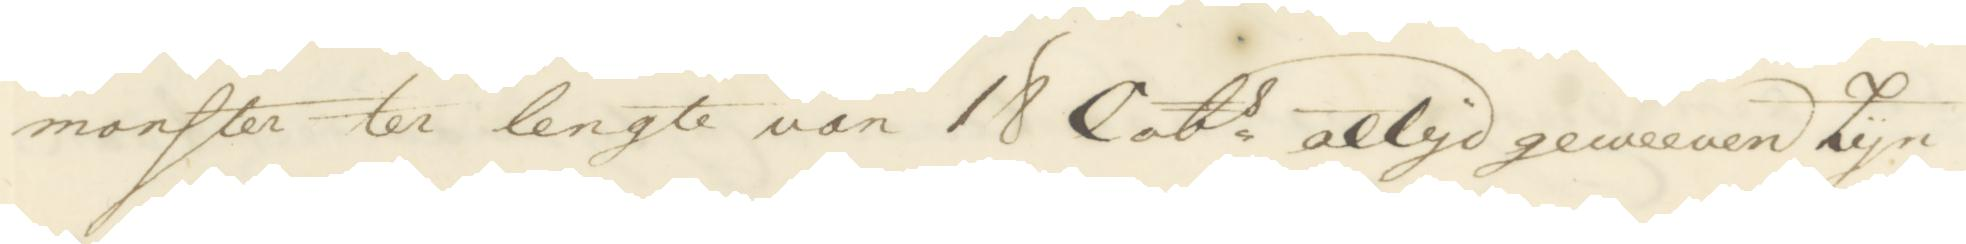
monster ter lengte van 18 Cob„s altijd geweeven zijn
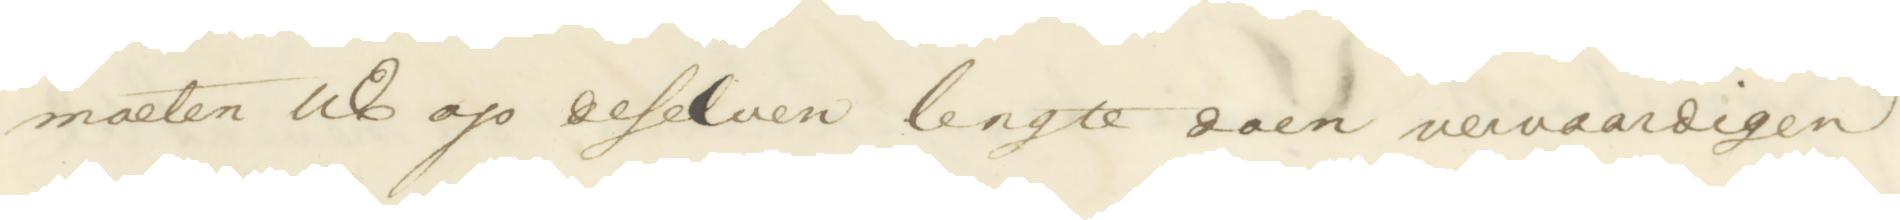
moeten UE op deselven lengte doen vervaardigen
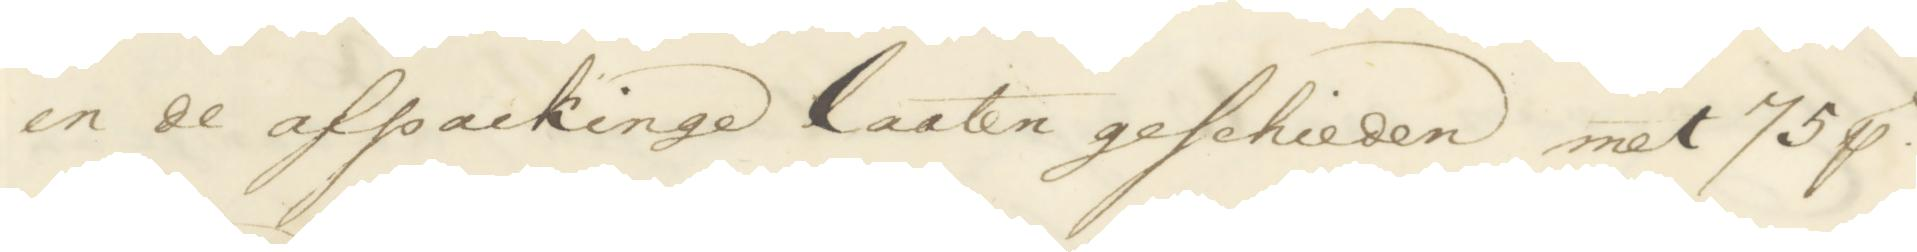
en de afpackinge laaten geschieden met 75 p.s
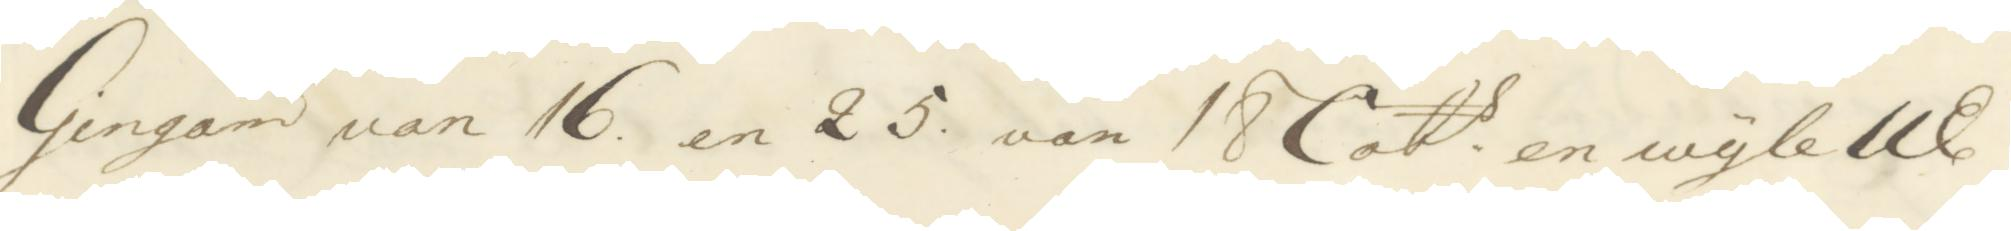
Gingam van 16. en 25. van 18 Cob.s en wijle UE
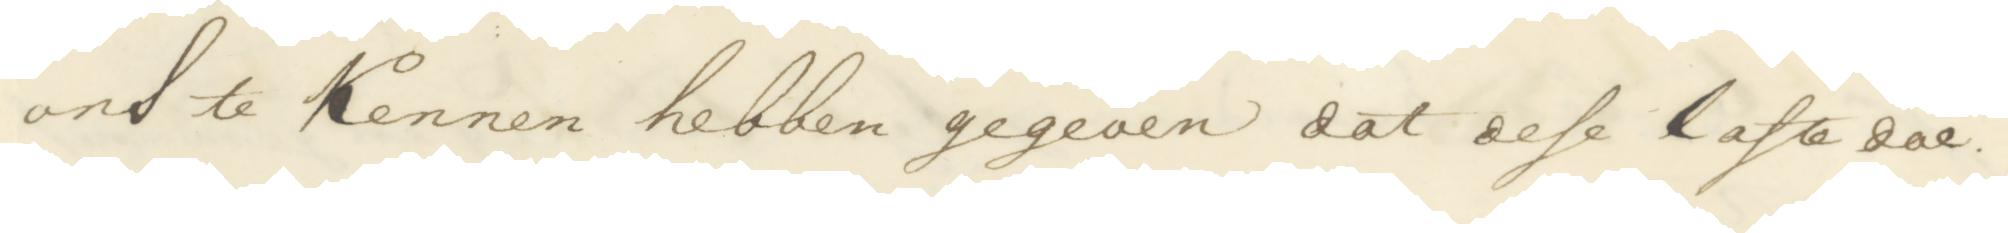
ons te kennen hebben gegeven dat dese laste doe„
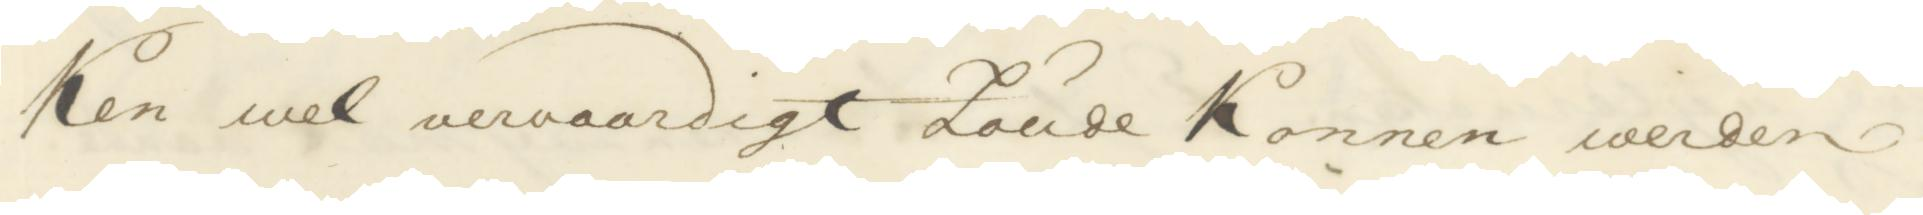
ken wel vervaardigt zoude konnen werden
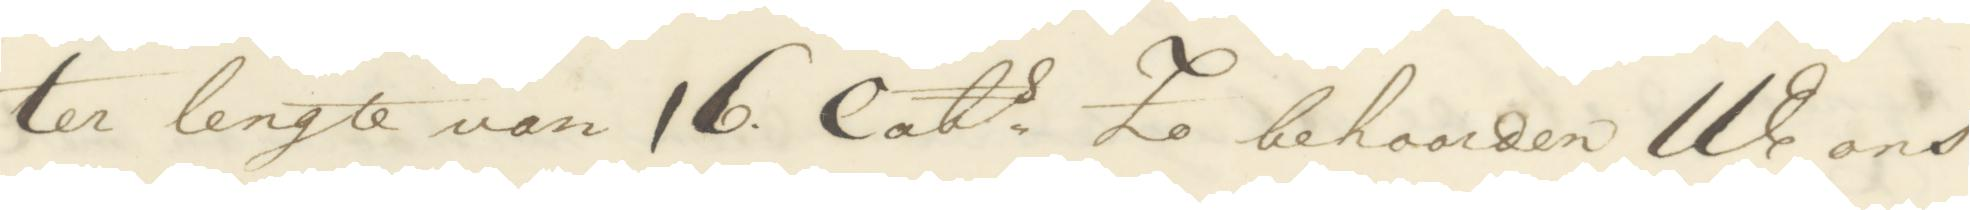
ter lengte van 16. Cab„s zo behoorden UE ons
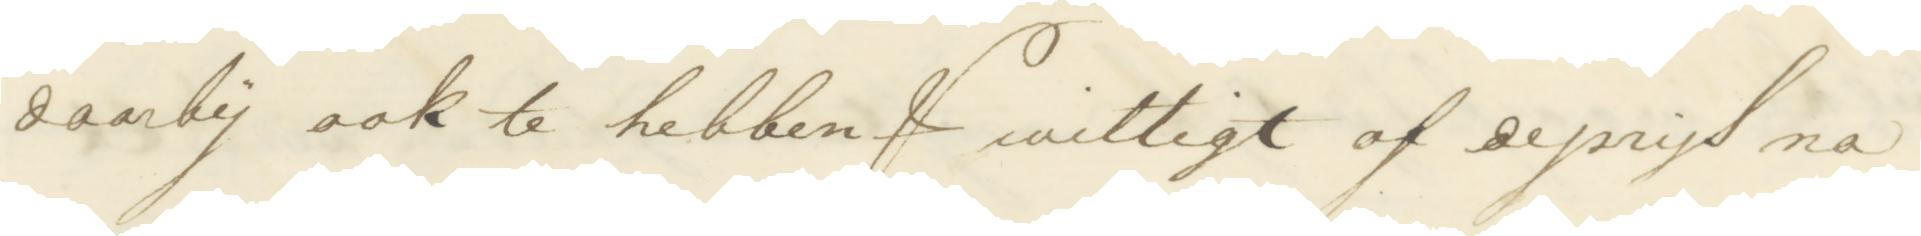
daarbij ook te hebben verwittigt of de prijs na
